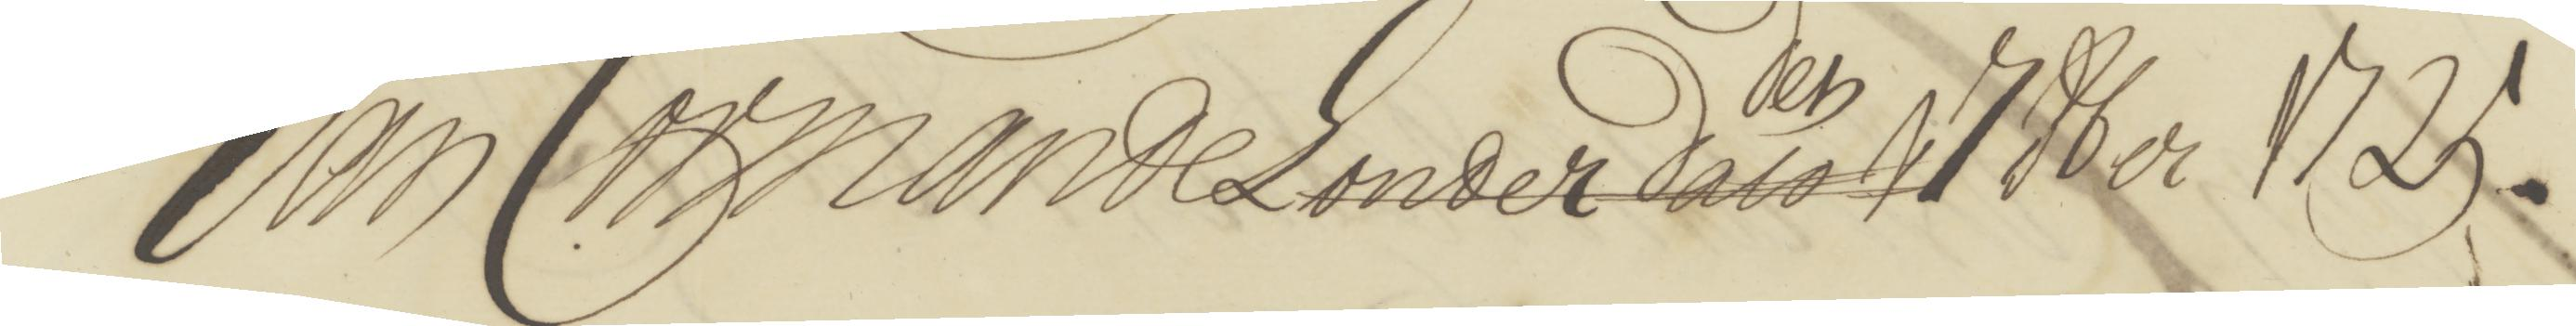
Van Cormandel onder dato 17 8ber 1725.
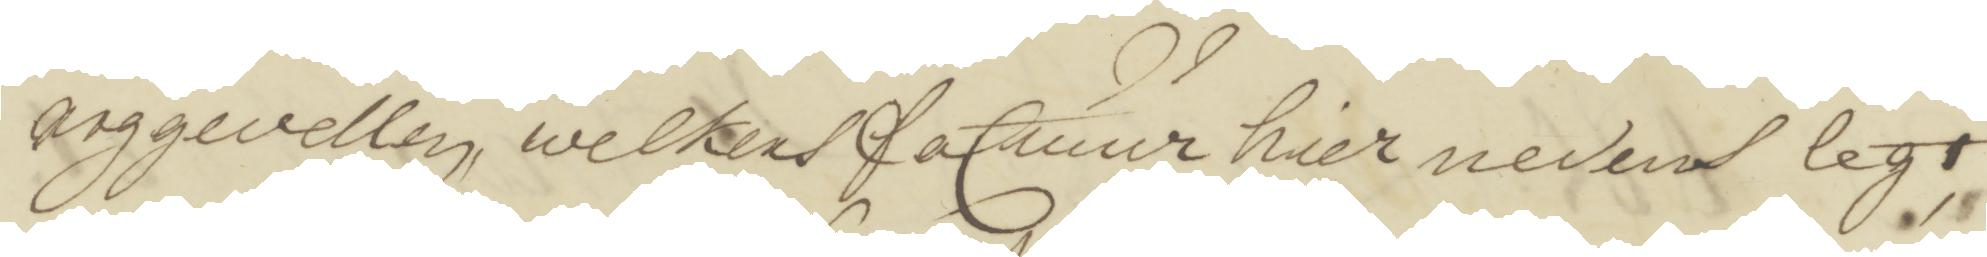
arggevellen, welkers factuur hier nevens legt,
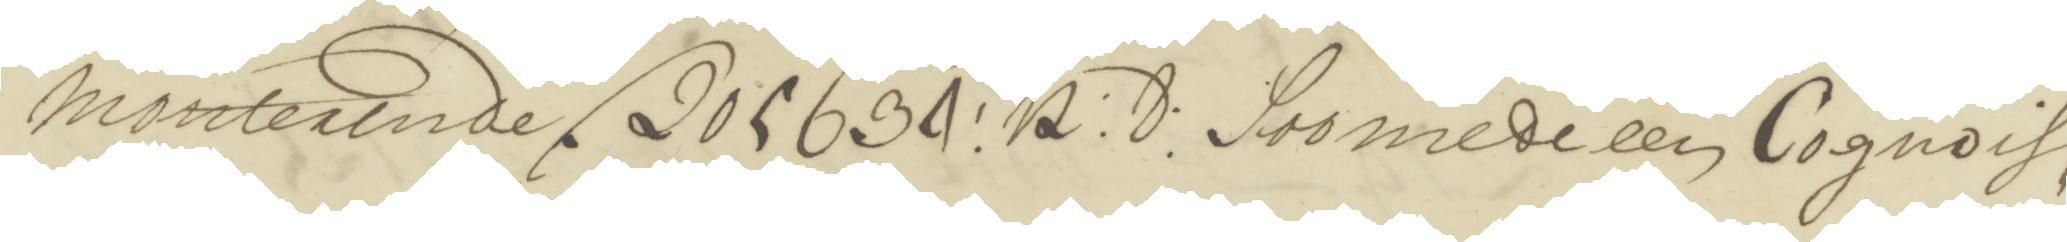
monterende ƒ 205634: 12: 8: soo mede een Cognois
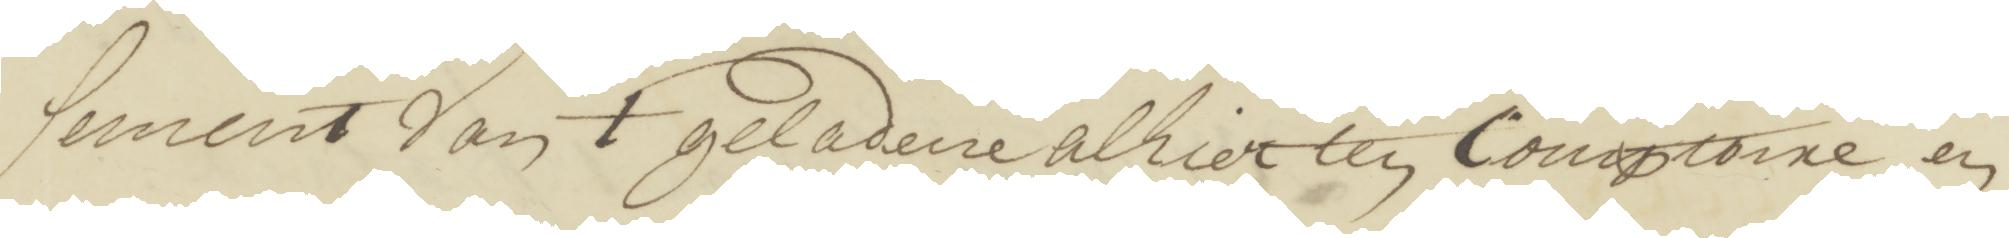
sement van ’t geladene alhier ten Comptoire, en
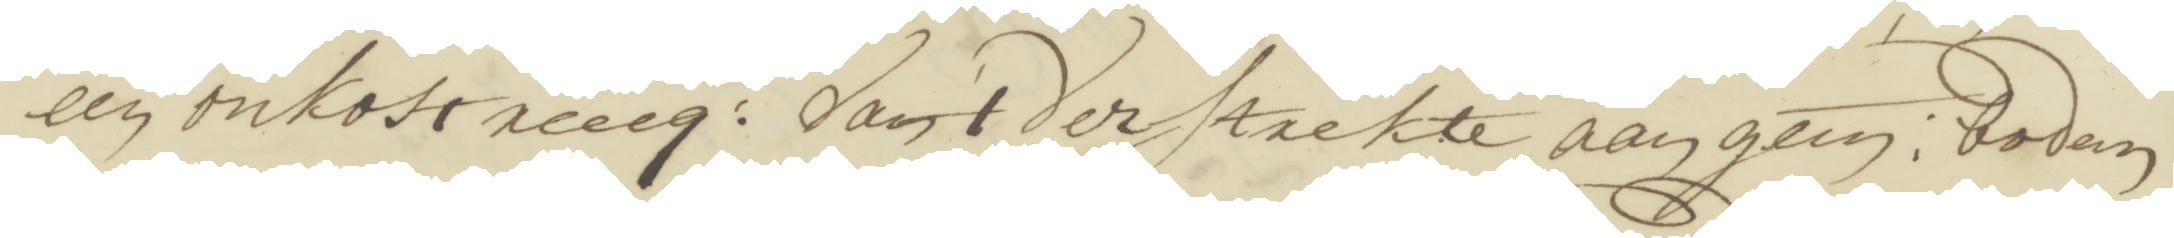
een onkost reecq: van ’t Verstrekte aan gem: bodem
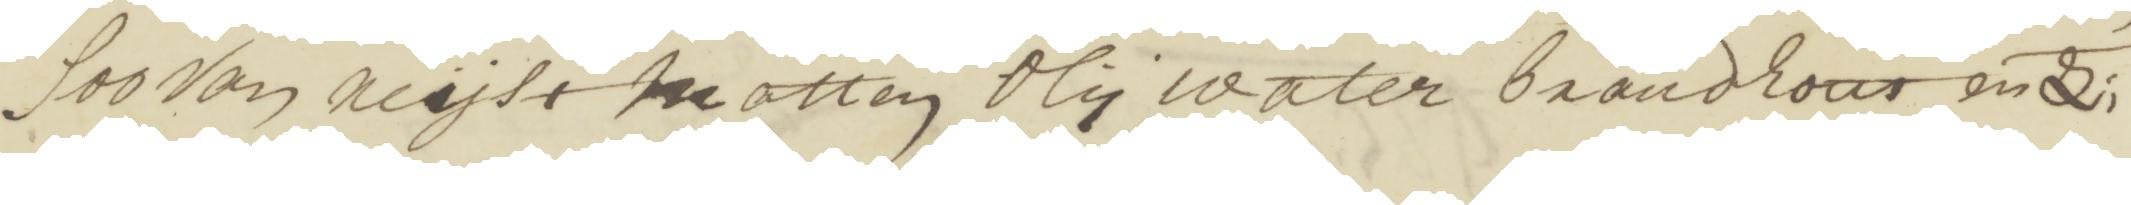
soo van reijst matten olij water brandhout enz;
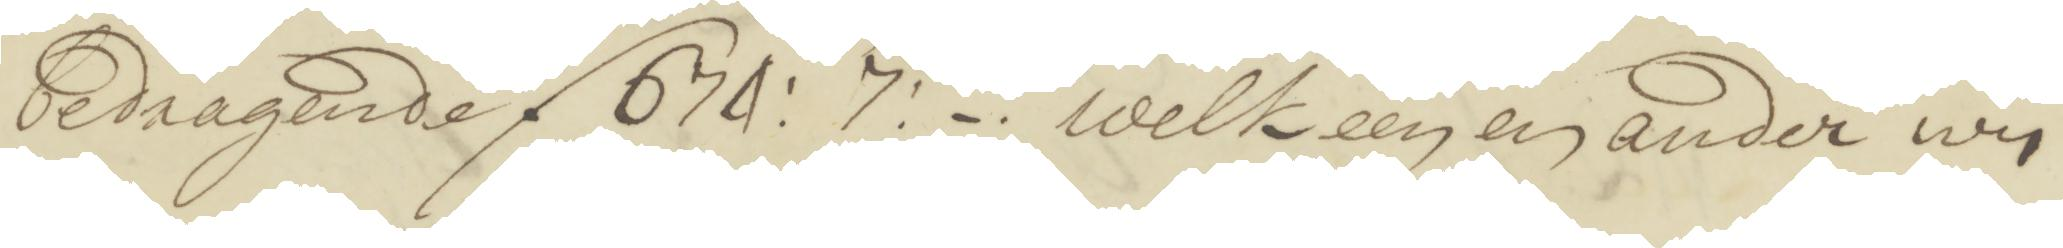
bedragende ƒ 674: 7: —. welk een en ander wij
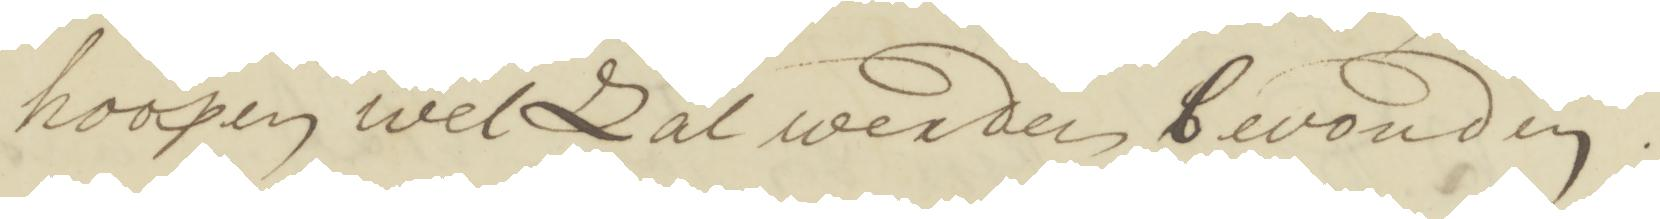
hoopen wel zal werden bevonden
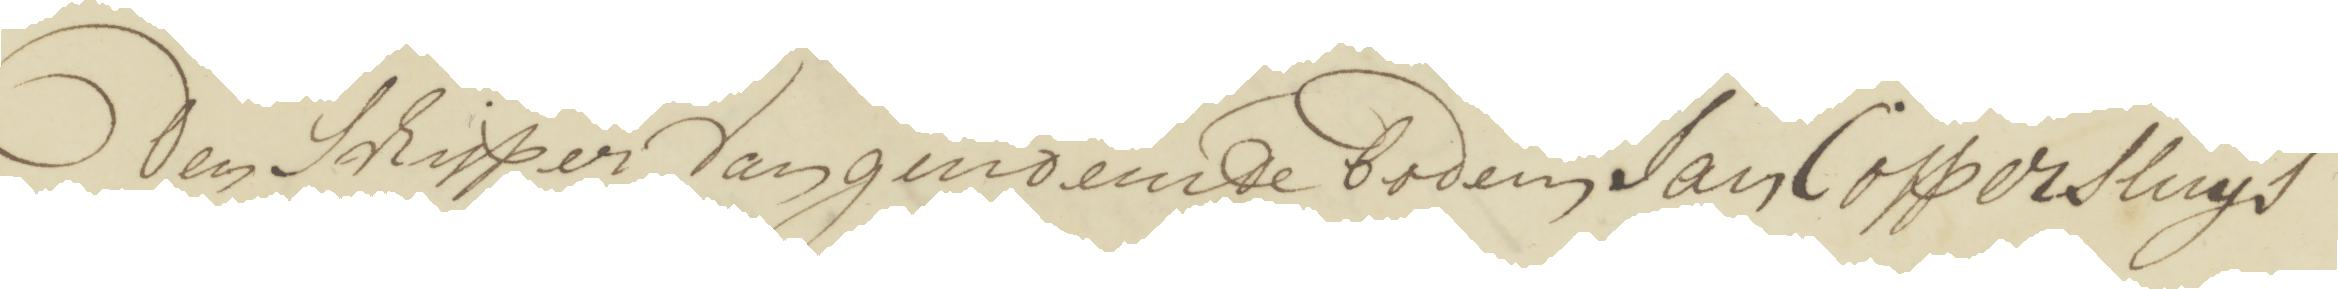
den schipper van gindemde bodem Ian Coppersluijs
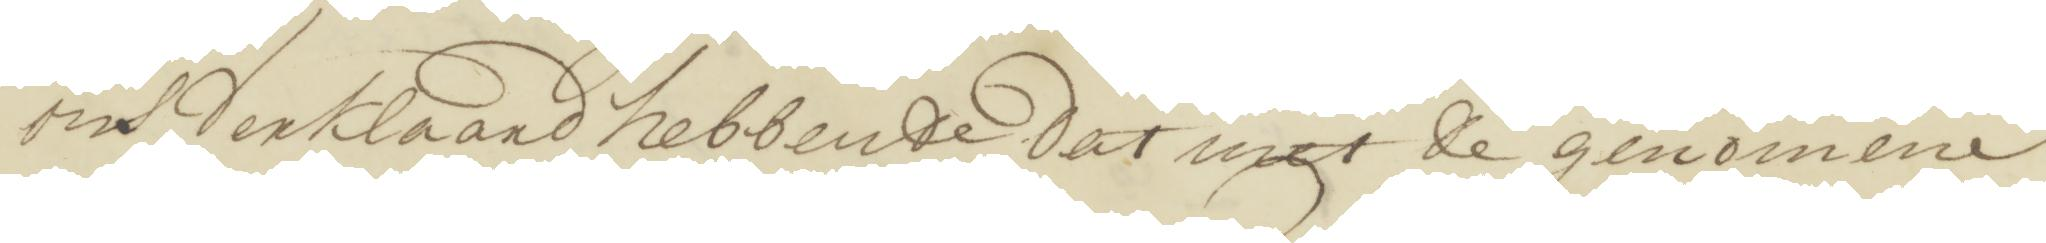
ons Verklaard hebbende dat met de genomene
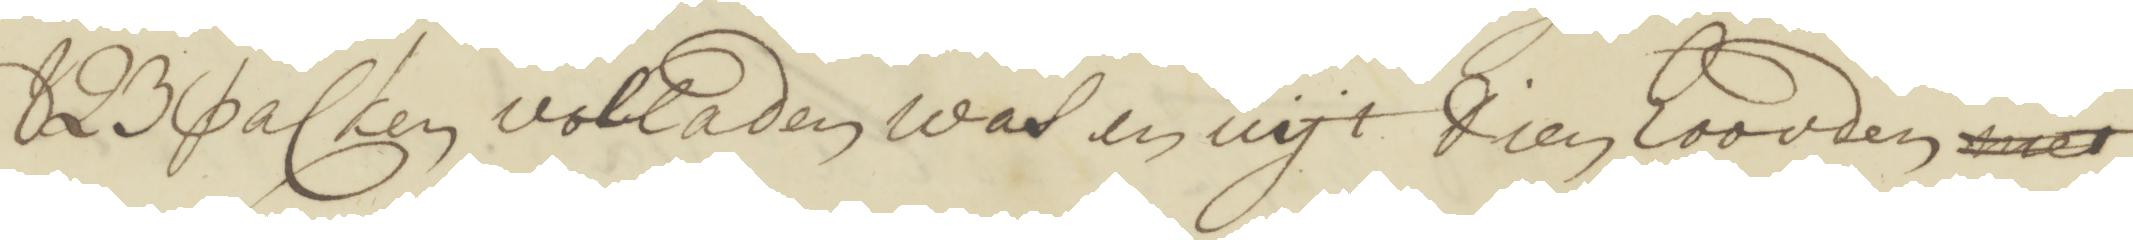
823 packen volladen was en uijt dien hoovden niet
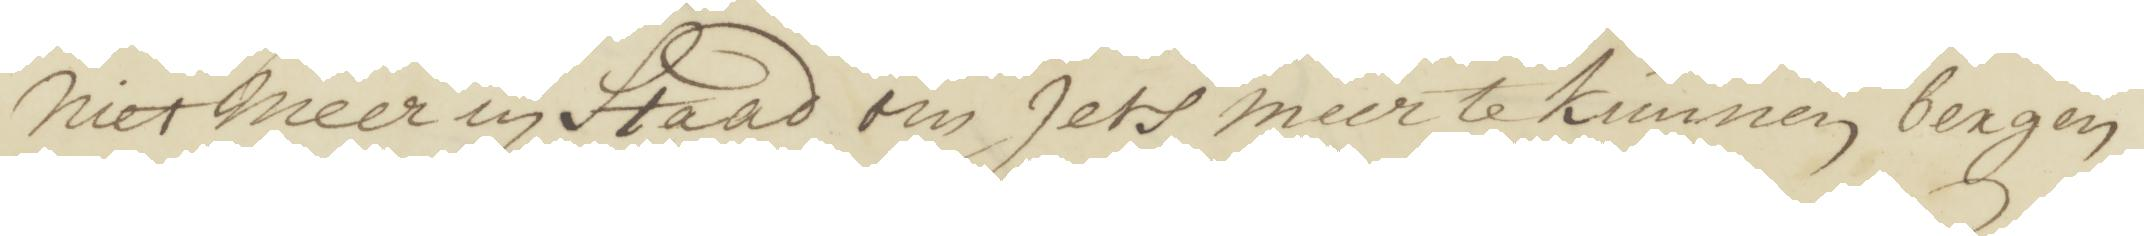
niet meer in staad om jets meer te kunnen bergen,
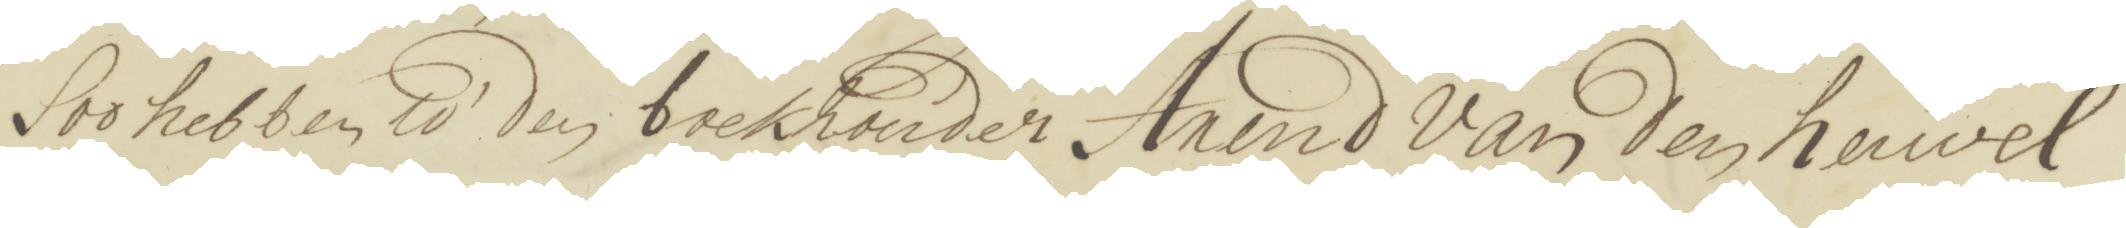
soo hebben w' den boekhouder Arend van den heuvel
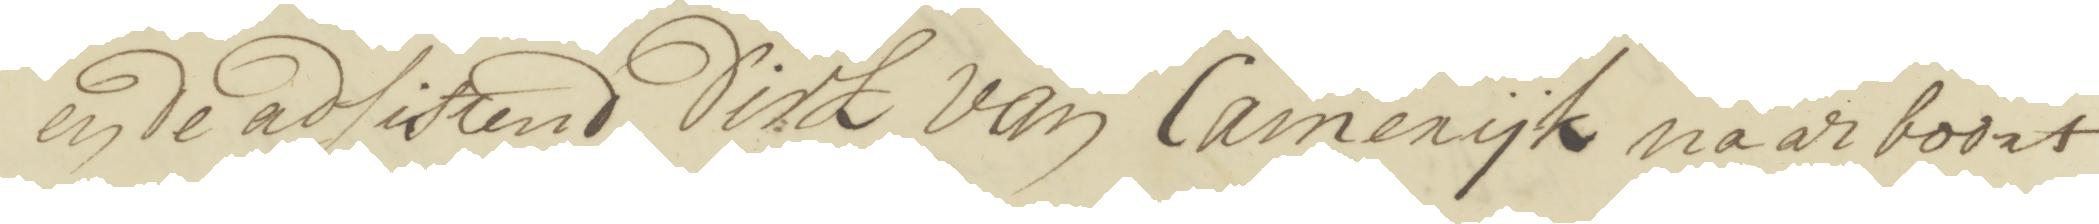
en de adsistend Dirk van Camerijk naar boort
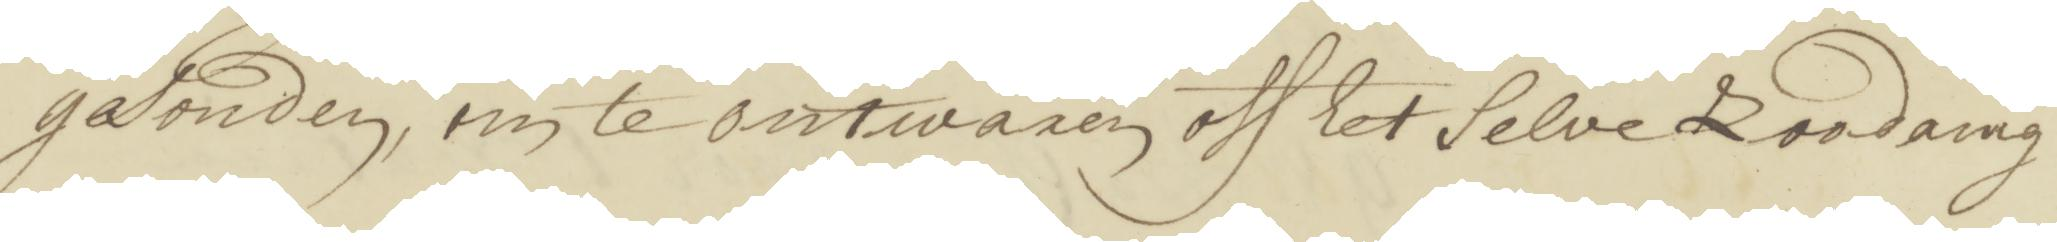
gesonden, om te ontwaren off het selve zoodanig
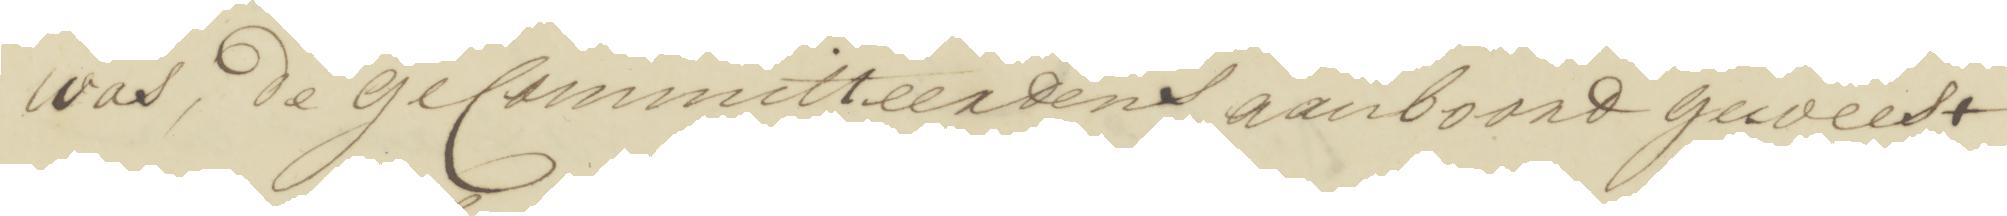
was, de gecommitteerdens aanboord geweest
